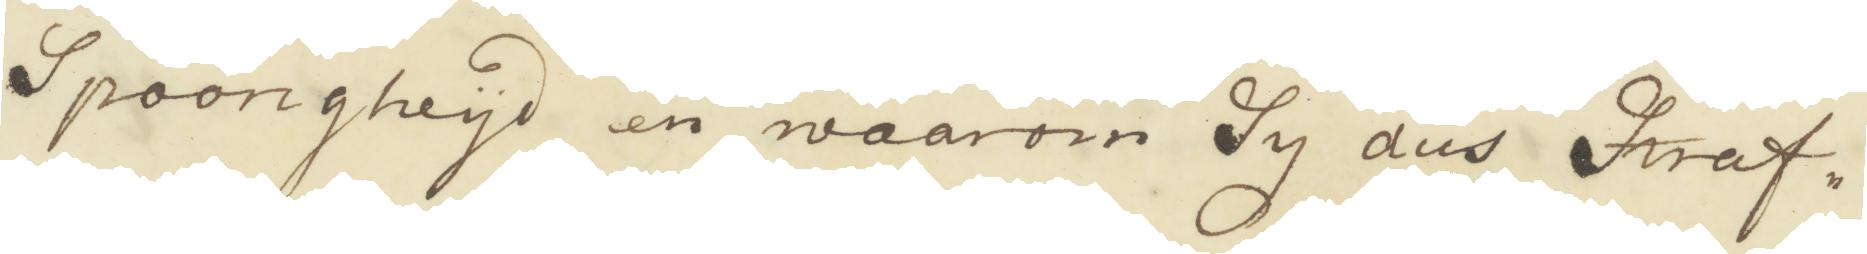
spoorigheijd en waarom Sy dus Straf„
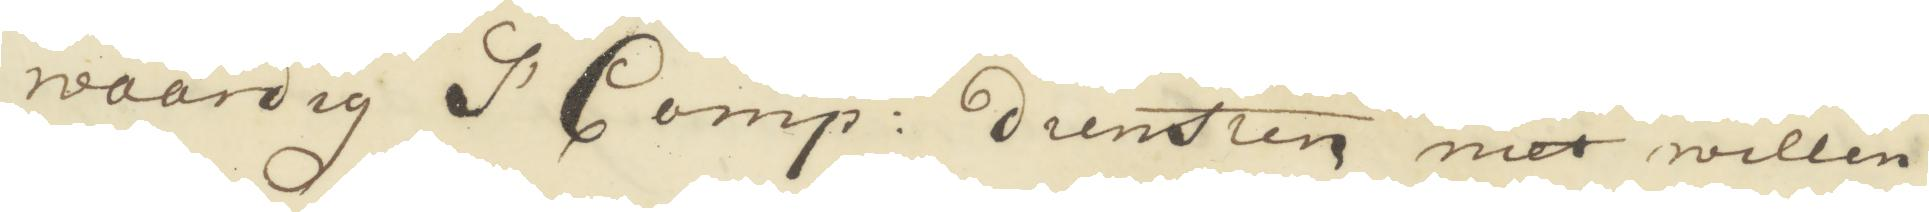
waardig S' Comp: diensten niet willen
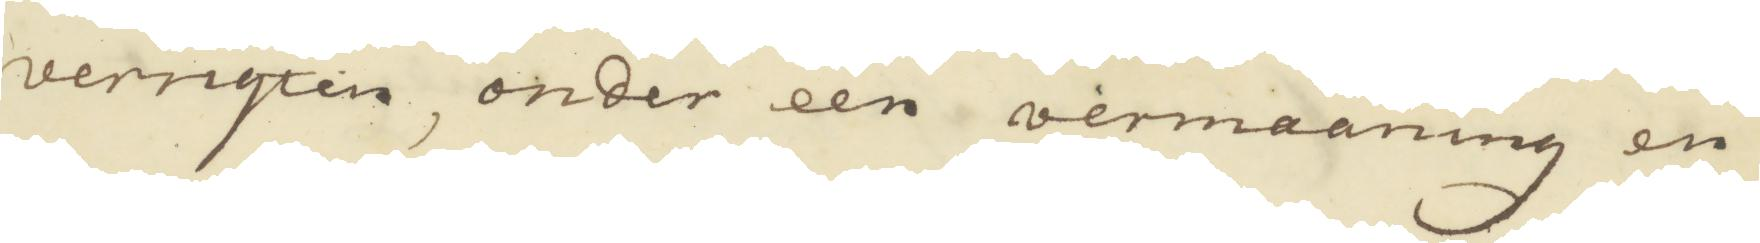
verrigten onder een vermaaning en
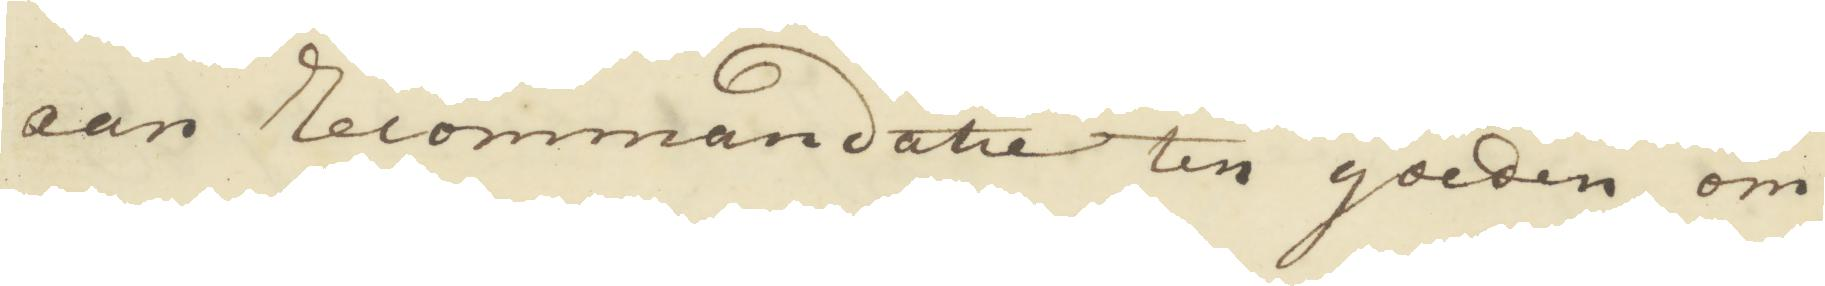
aan Recommandatie ten goeden om
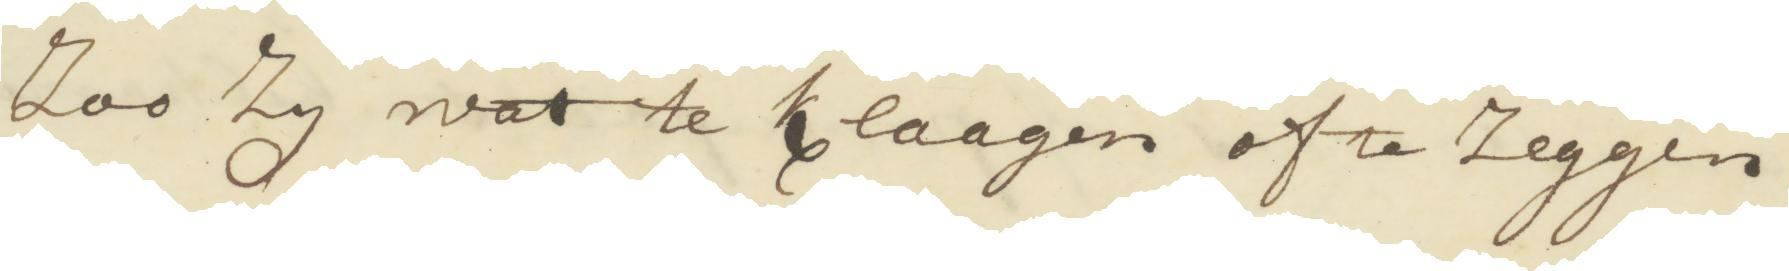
Zoo Zy wat te klaagen of te Zeggen
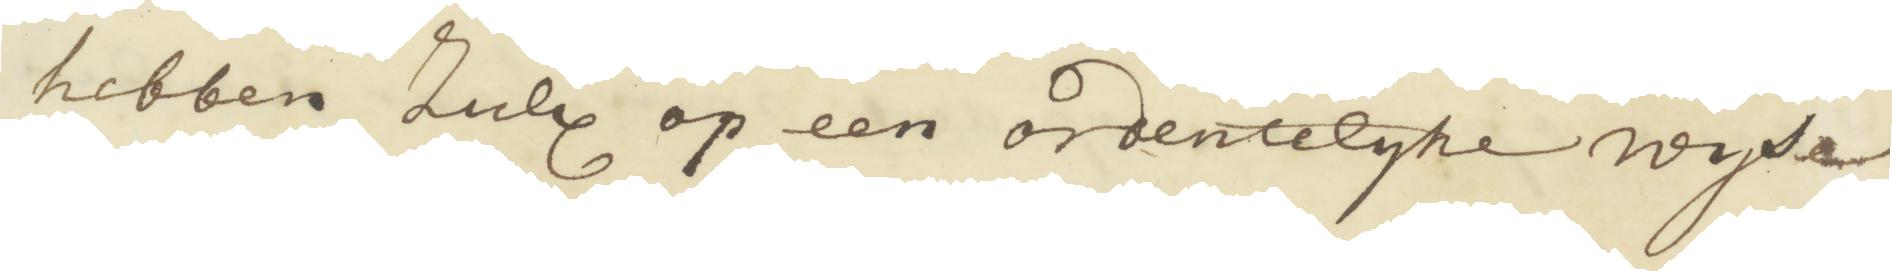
hebben Zulx op een ordenteljke wyse
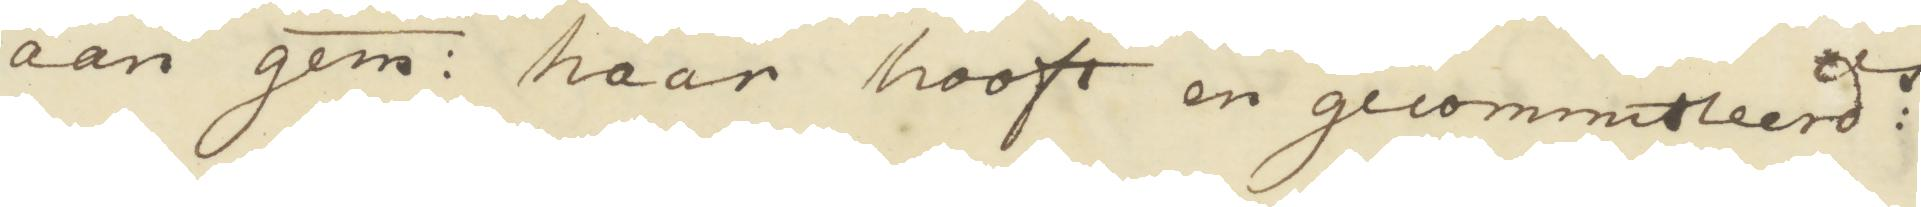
aan gem: haar hooft en gecommitteerd:s
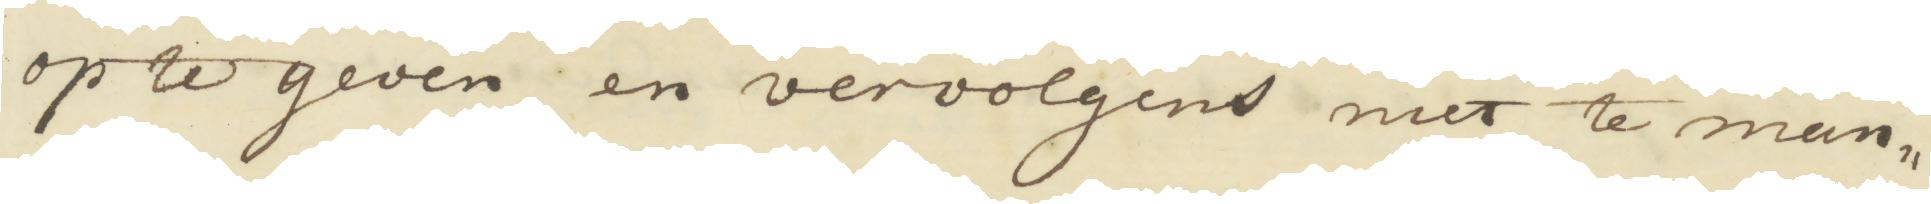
op te geven en vervolgens niet te man„
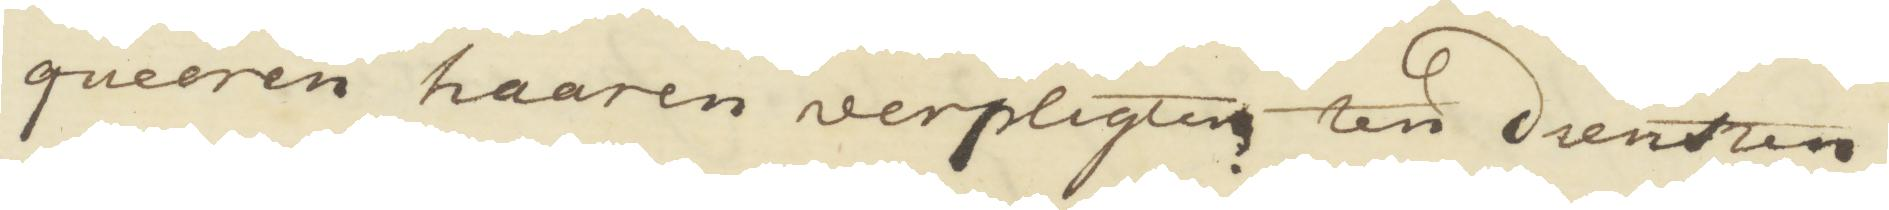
queeren haaren verpligten ten diensten
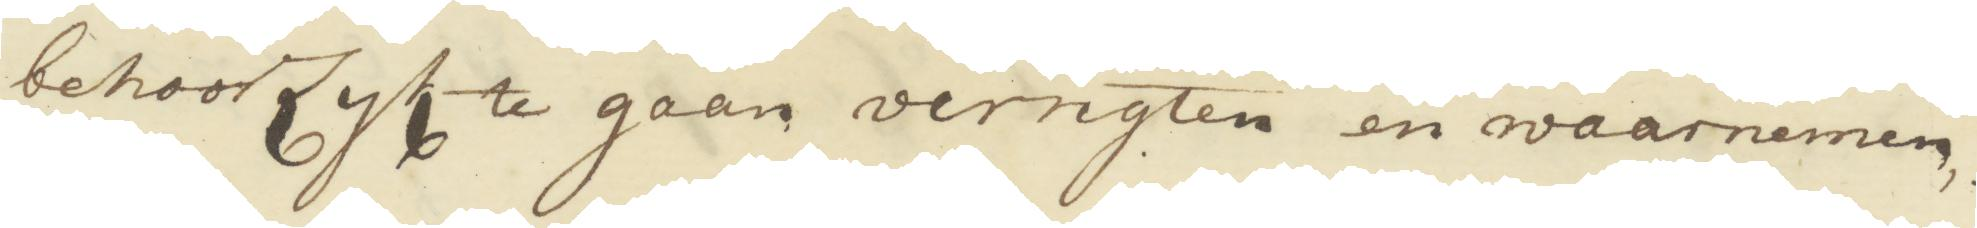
behoorlyk te gaan verrigten en waarnemen,
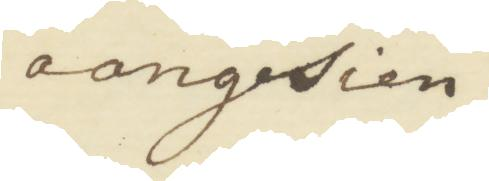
aangesien
